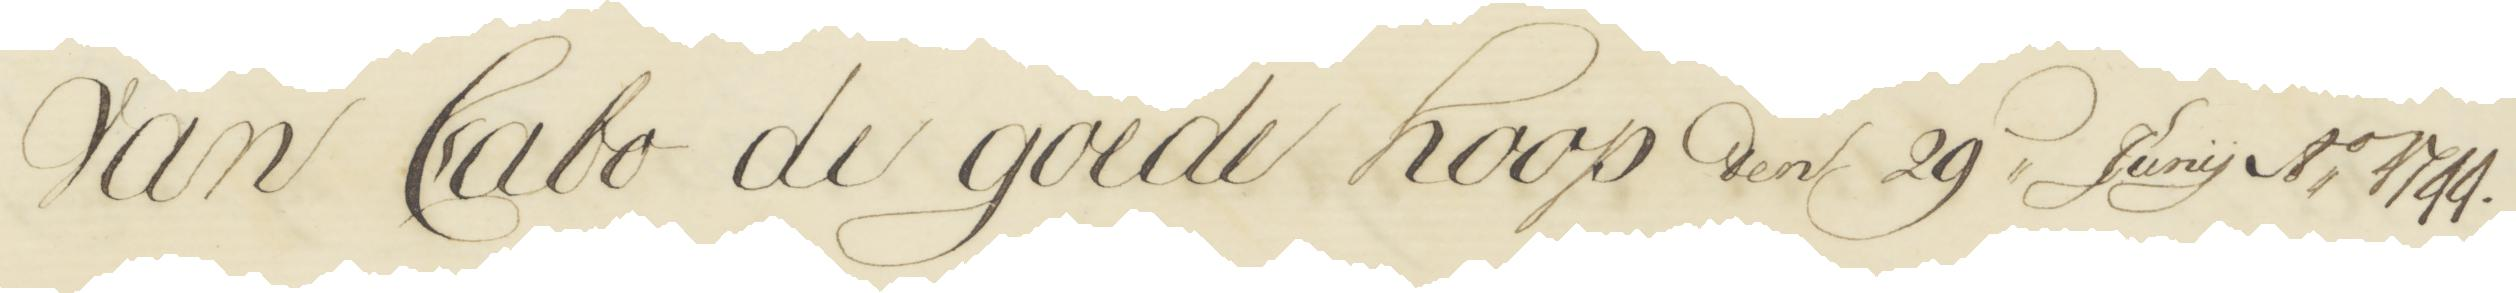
Van Cabo de goede hoop den 29„' Junij A„o 1744.
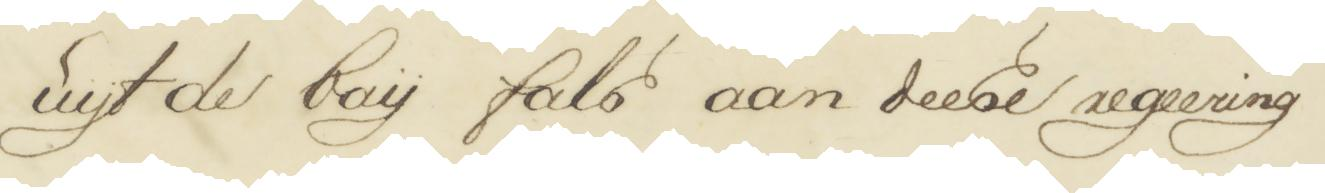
uijt de baij fals aan deese regeering
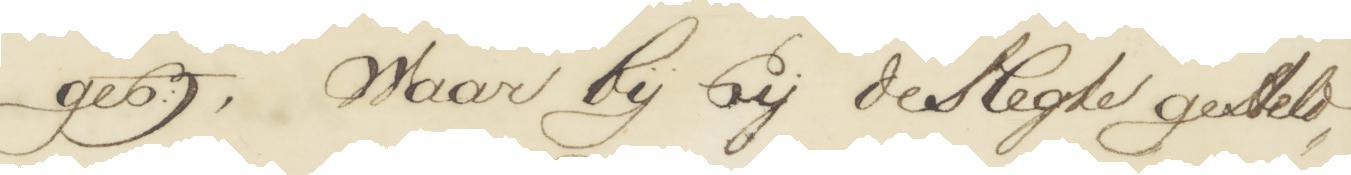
ges:z, waar bij sij deslegte gesteld„
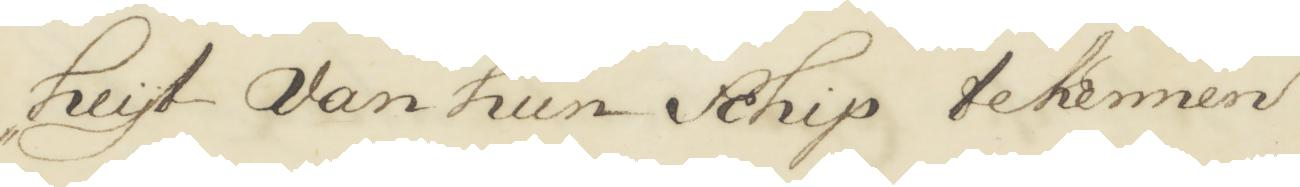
heijt van hun schip te kennen
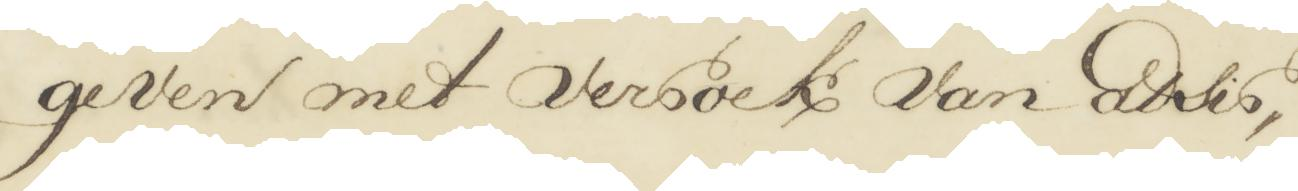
geven met versoek van adsis„
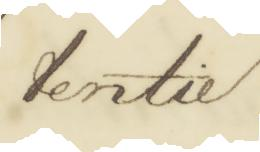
tentie
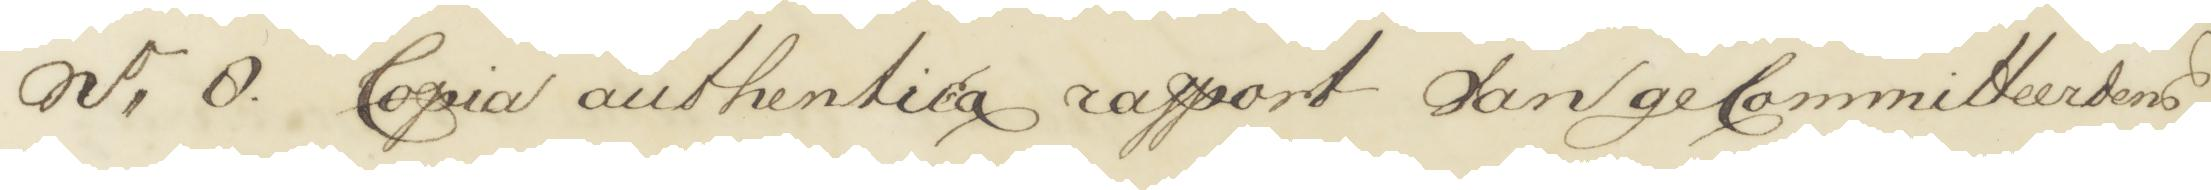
n„o 8. Copia authenticq rapport van gecommitteerdens
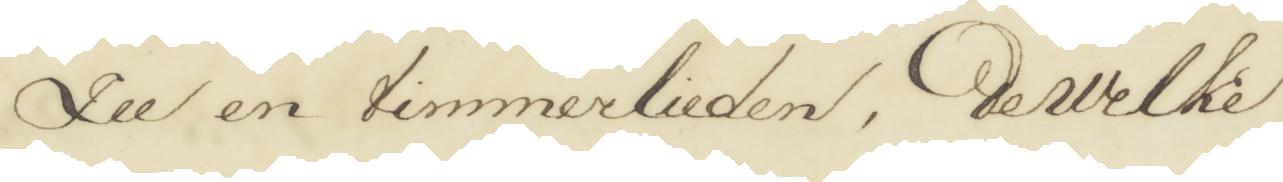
zee en timmerlieden, dewelke
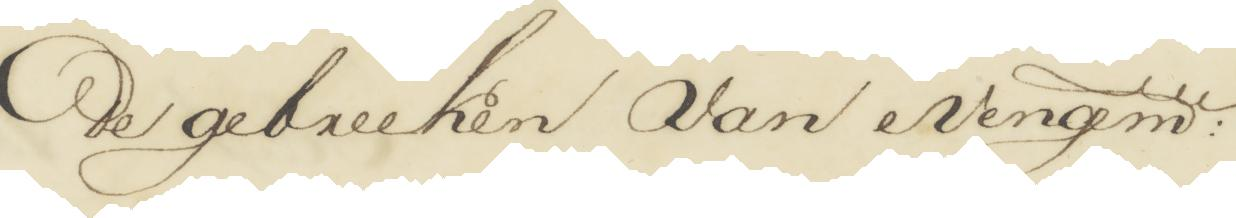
de gebreeken van evengem:
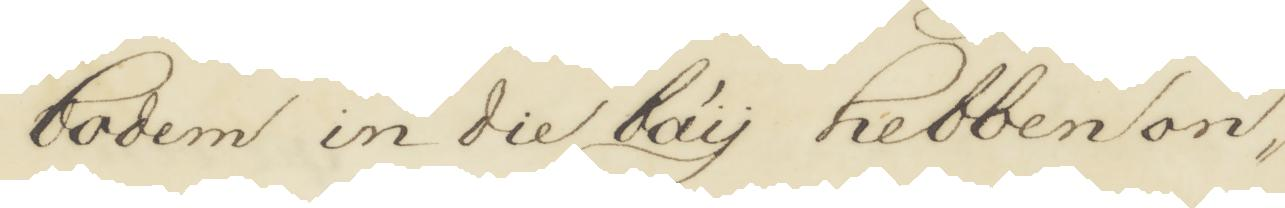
bodem in die baij hebben on„
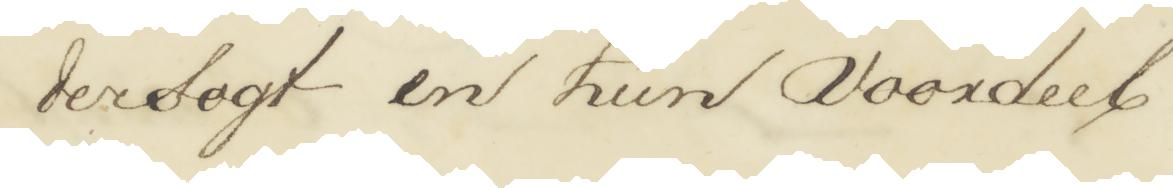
dersogt en hun voordeel
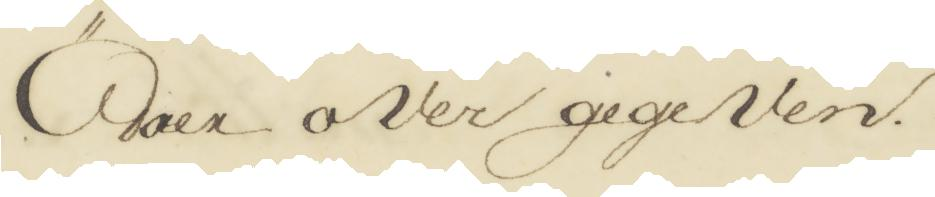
daer over gegeven.
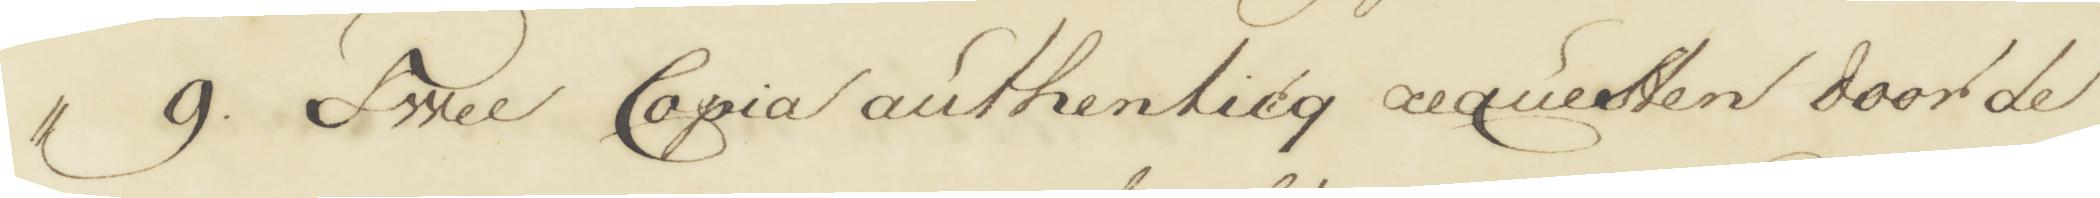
„ 9. Twee Copia authenticq requesten door de
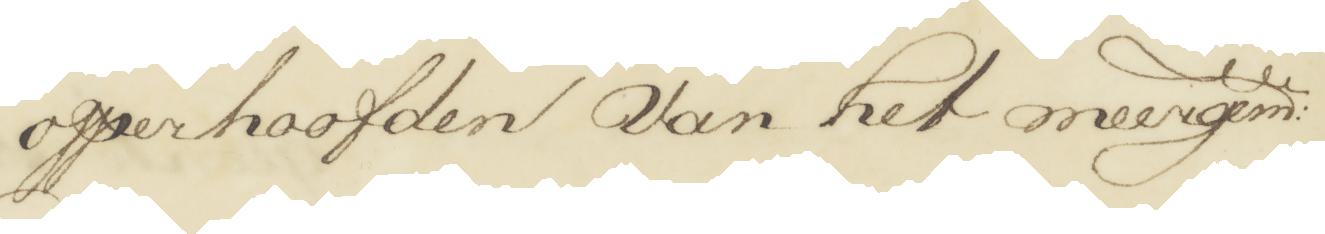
opperhoofden van het meer gem:
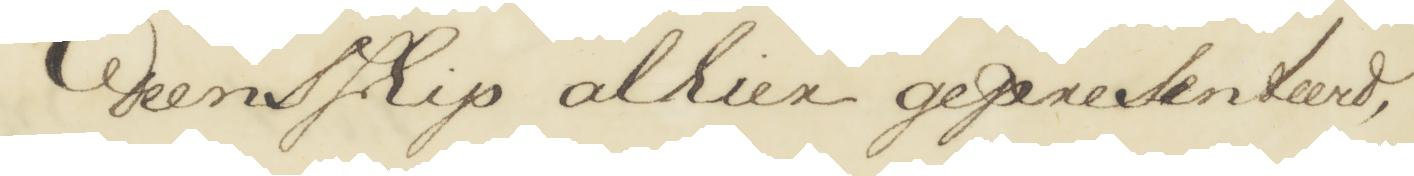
deens schip alhier gepresenteerd,
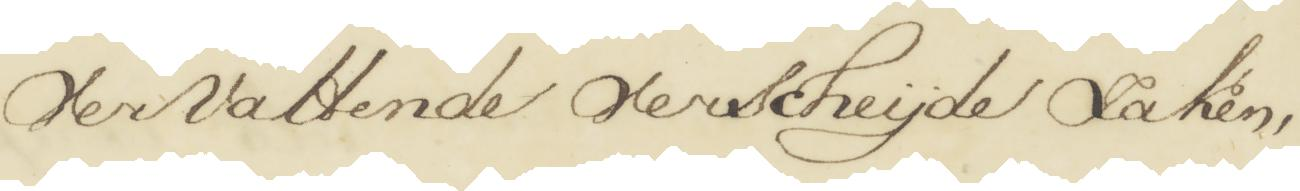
vervattende verscheijde zaken,
